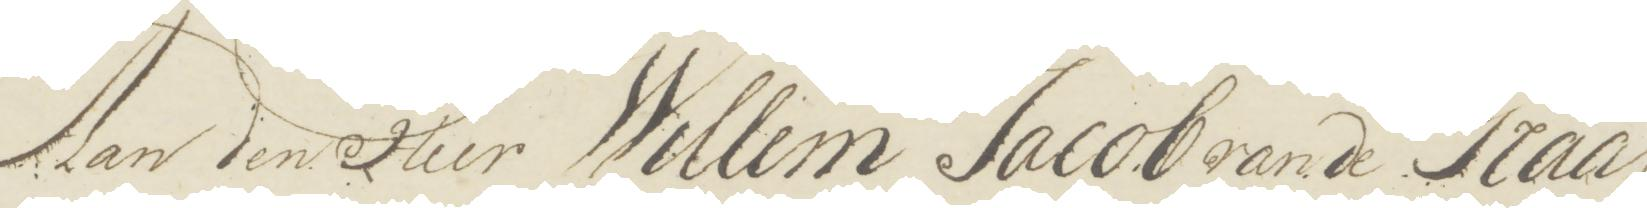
Van den Heer Willem Jacob van de Graaf
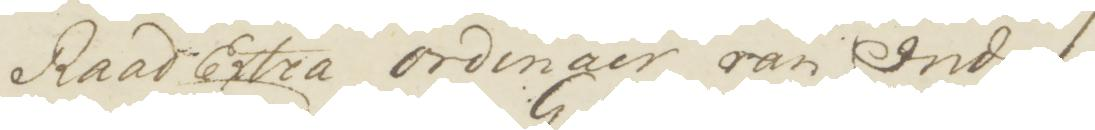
Raad Extra ordinair van Indie
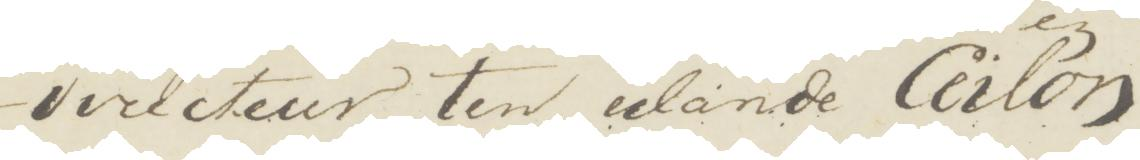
directeur ten eilande Ceilon en
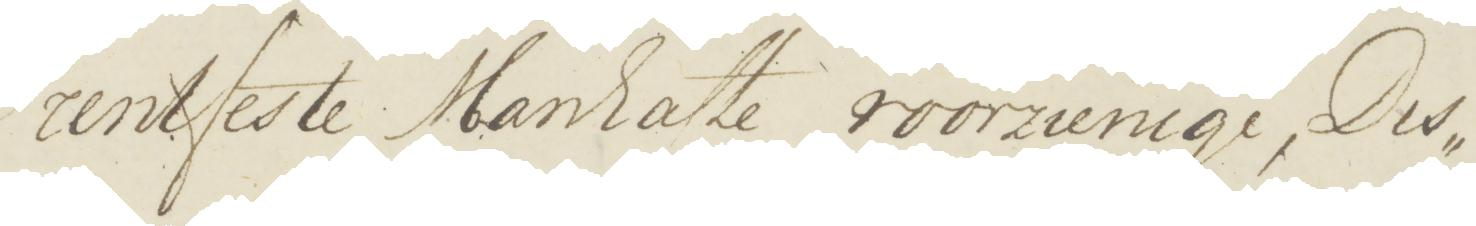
rentfeste Manhafte voorzienige, Dis„
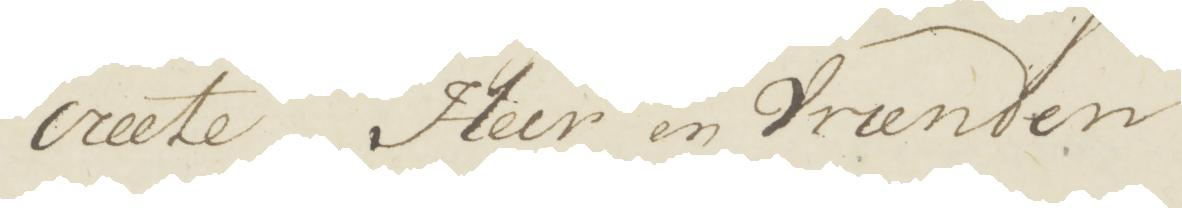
creete Heer en Vrienden
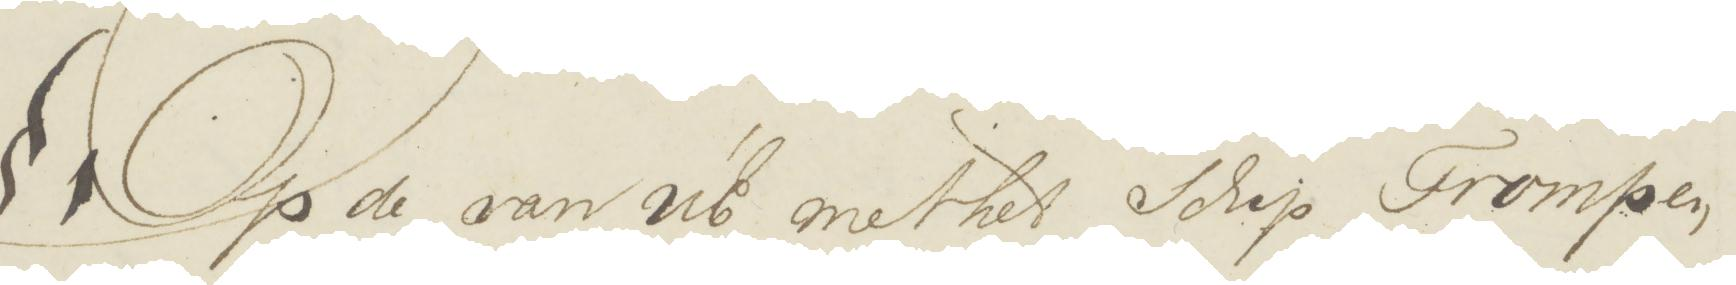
§ 1 Op de van u'E met het schip Trompen
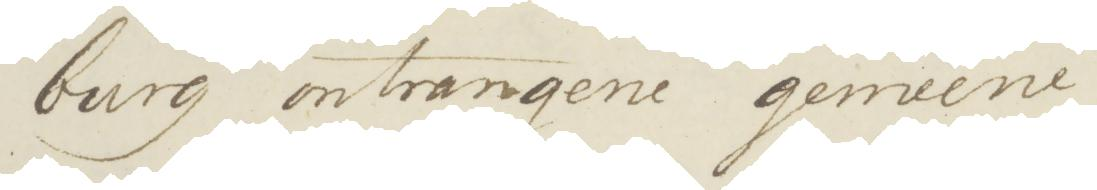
burg ontvangene gemeene
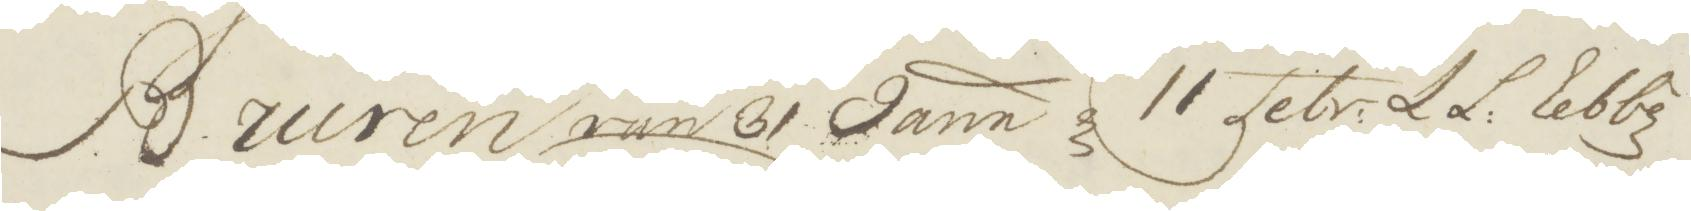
Brieven van 31 Jann en 11 Febr: J L. hebben
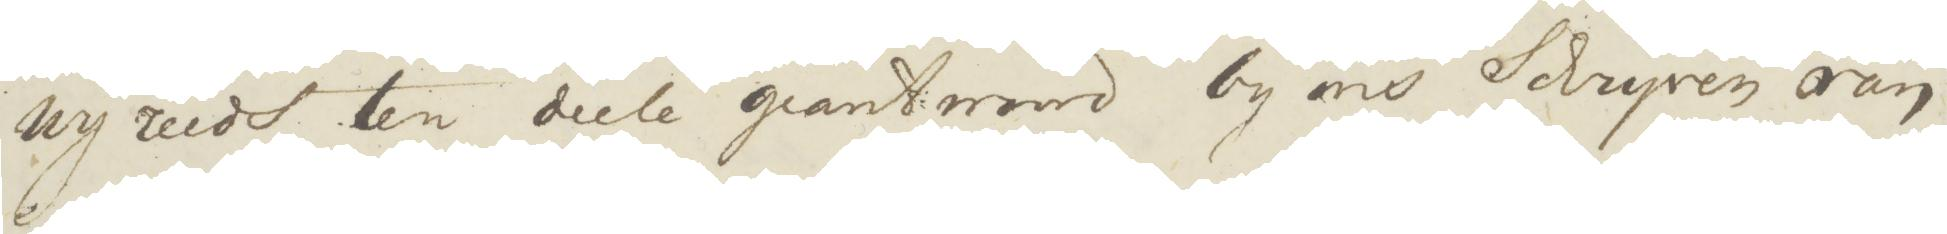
wy reeds ten deele geantwoord by ons Schryven van
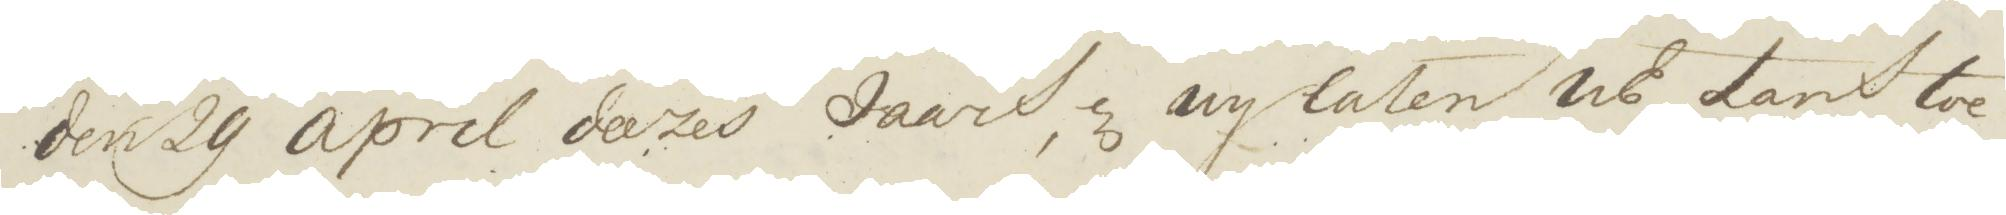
den 29 april deezes Jaars, en wy laten uE tans toe
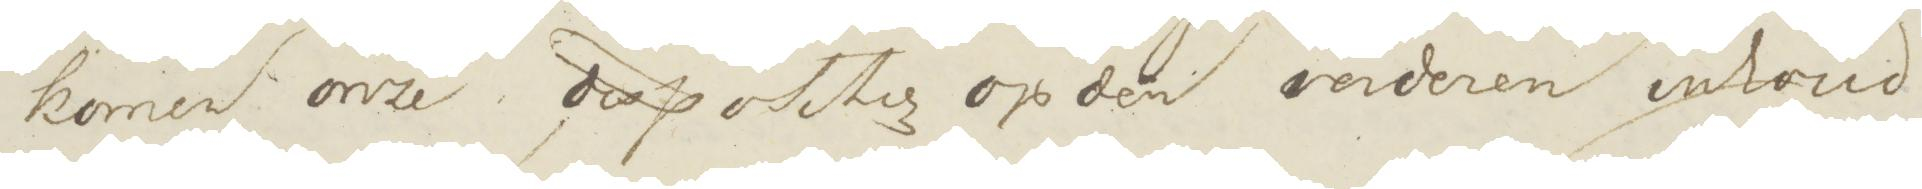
komen onze dispositien op den verderen inhoud
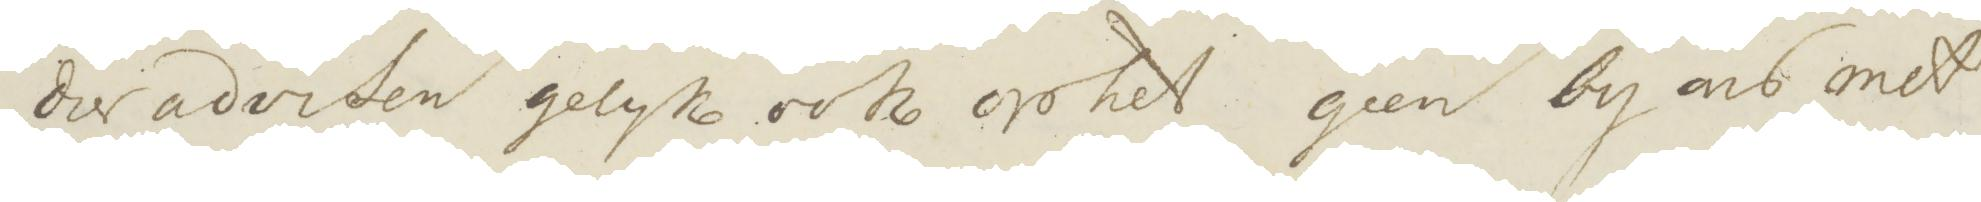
der advisen gelyk ook op het geen by ons met
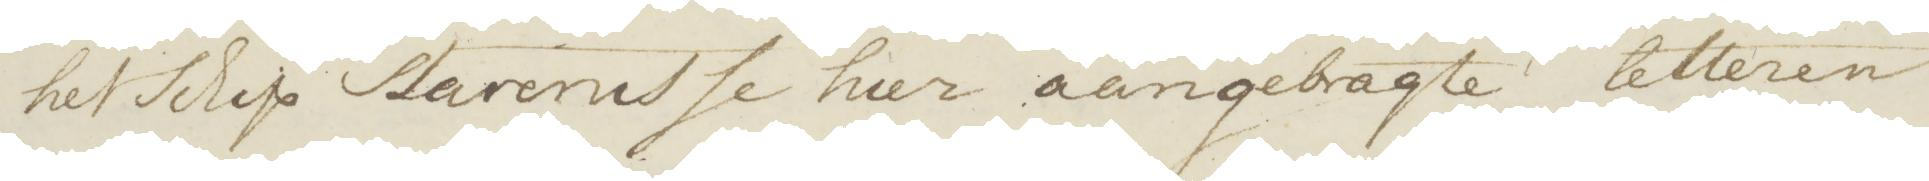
het Schip Stavenisse hier aangebagte letteren
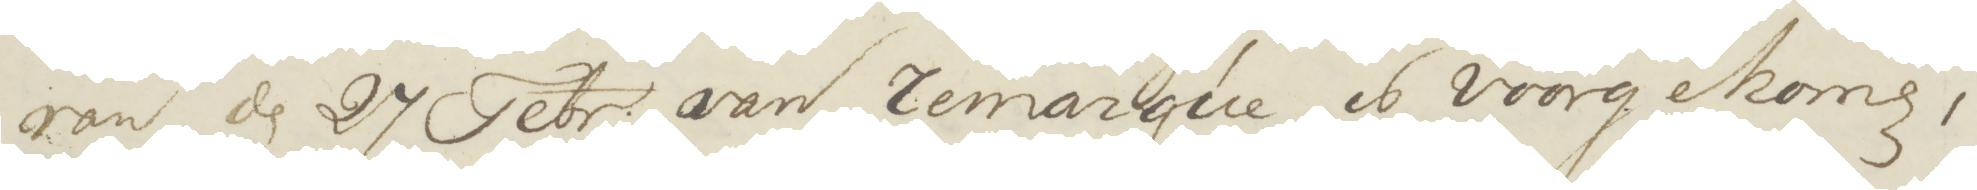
van den 27 Febr. van remarque is voorgekomen,
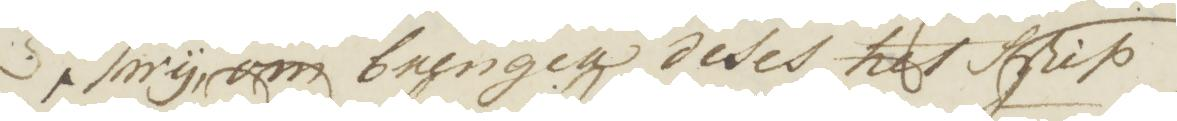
^ wij, om brenger deses het schip
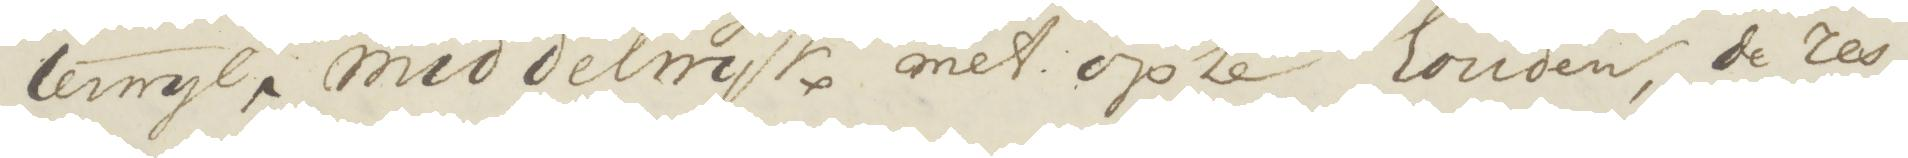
terwyl ^ middelwyk niet op te houden, de res
